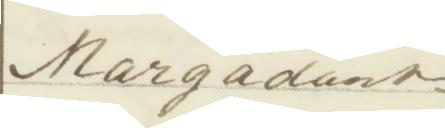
Margadant
